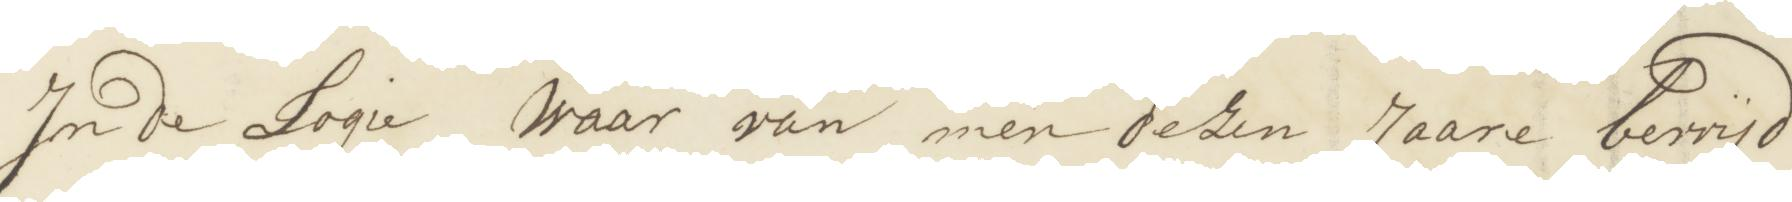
Jn de Logie waar van men dezen Jaare bevrijd
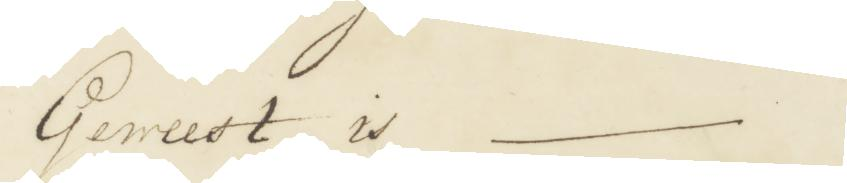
Geweet is —
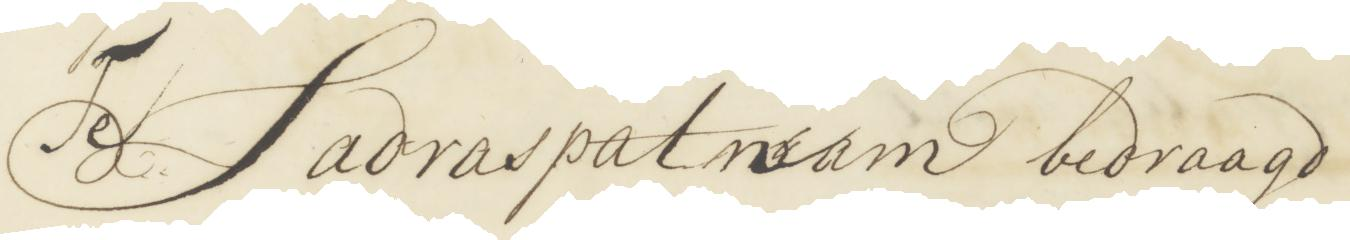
Te Sadraspatnam bedraagd
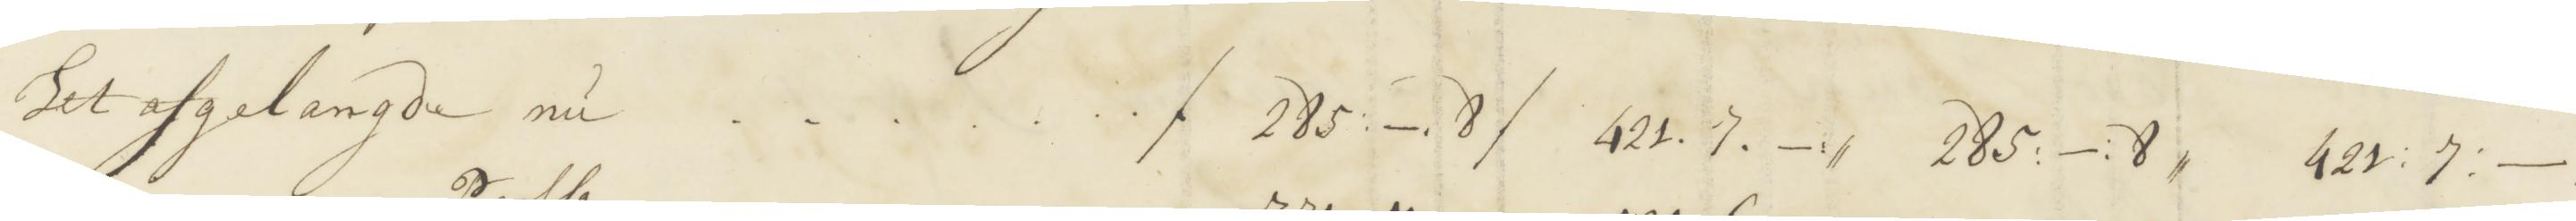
het afgelangde nu . . . . . . . ƒ 285:—.8 ƒ 421. 7.—.„ 285: —:8„ 421:7:—
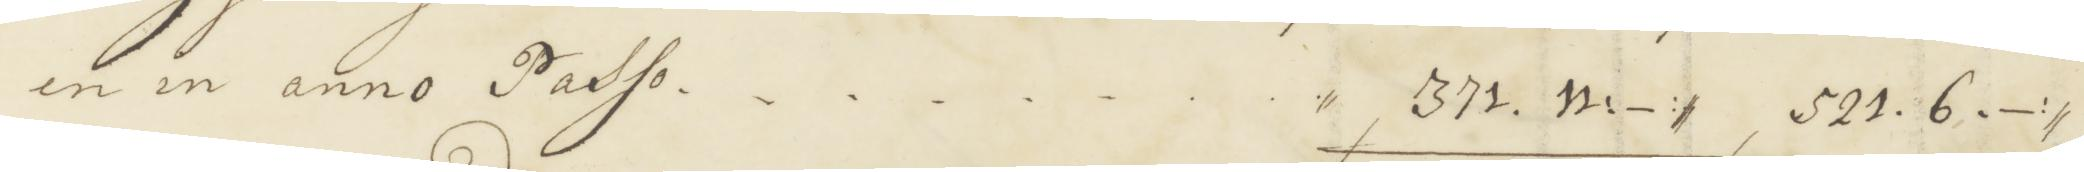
en in anno Passo . - . . . - . . .„ 371. 11:—:„ 521. 6.—:„
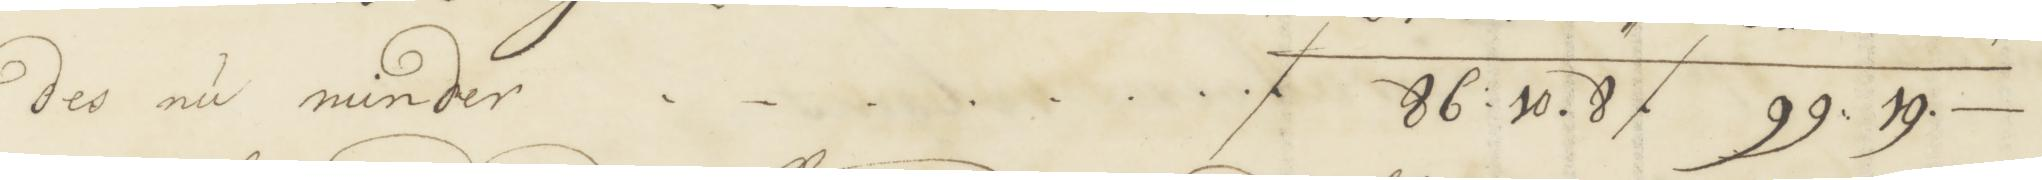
des nu minder - - . . . . . .ƒ 86: 10. 8 ƒ 99. 19. —
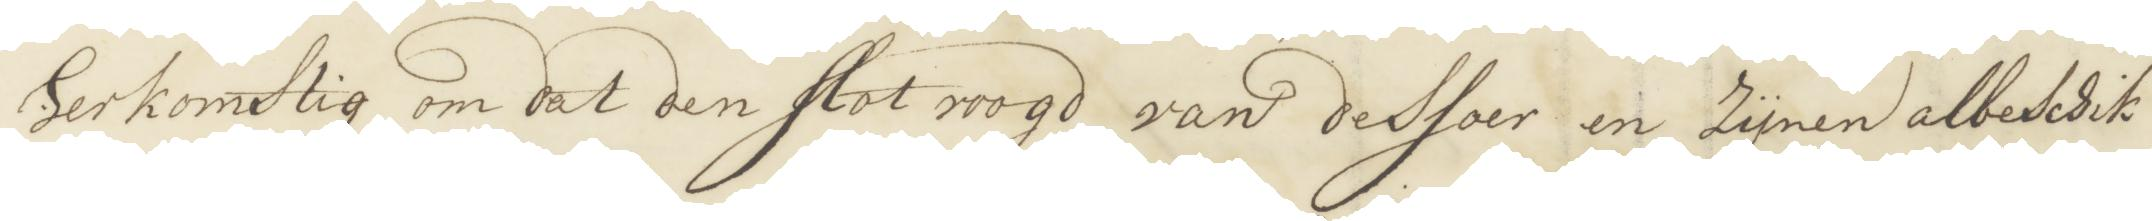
herkomstig om dat den slot voogd van dessoer en zijnen albeschik
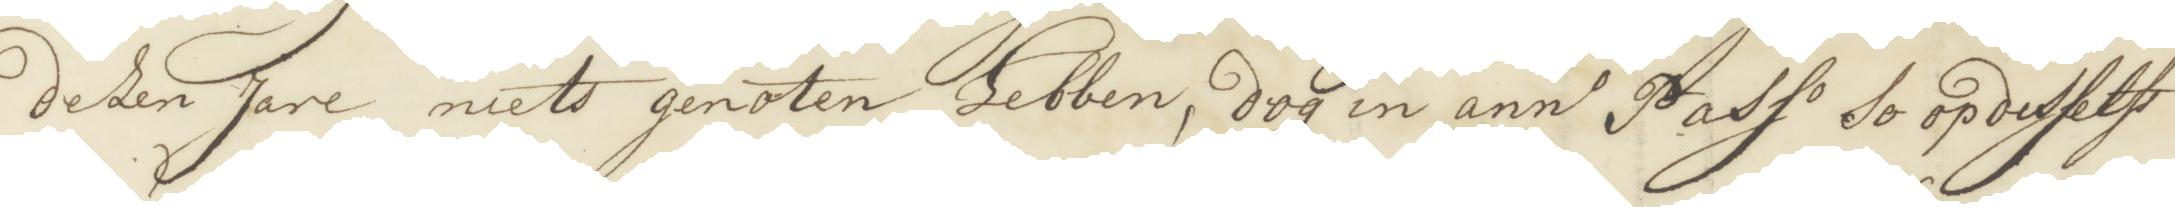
dezen Jare niets genoten hebben, dog in anno Passo so op desselfs
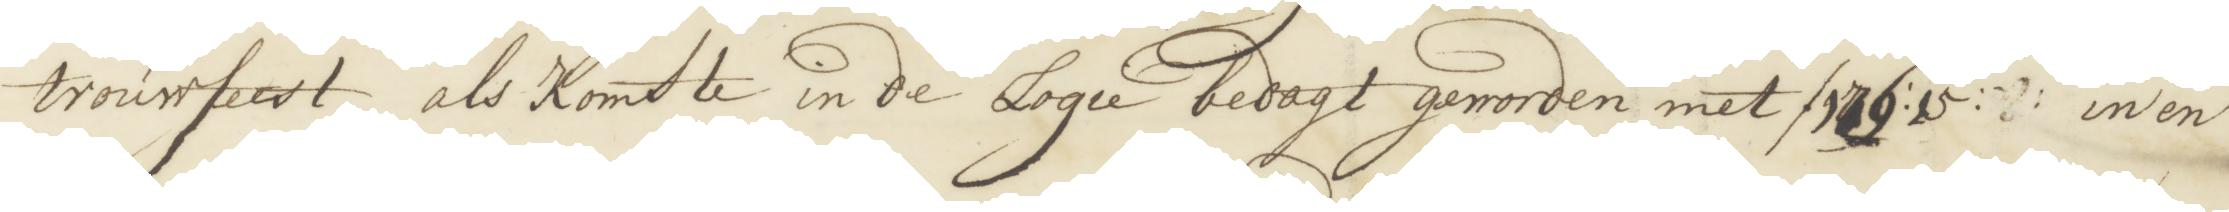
trouwfeest als komste in de Logie bedagt geworden met ƒ176: 15: 8: in en
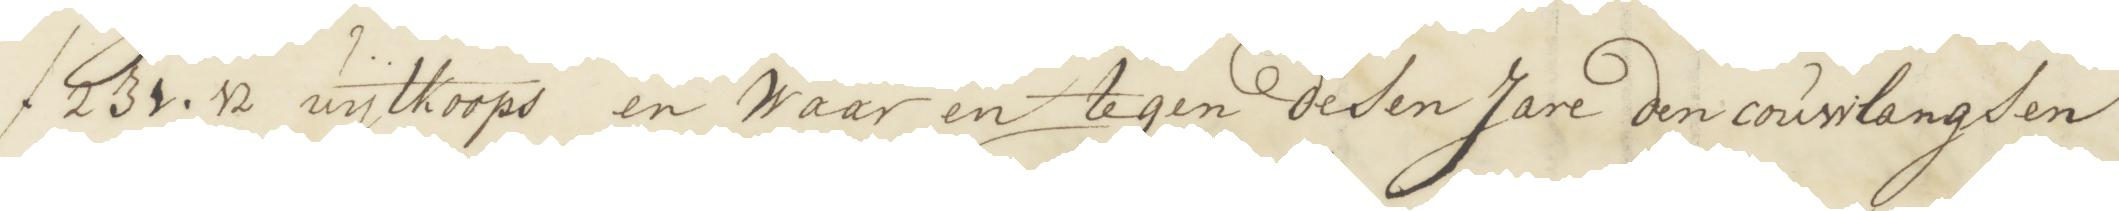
ƒ 231. 12 uijtkoops en waar en tegen desen Jare den couwlangsen
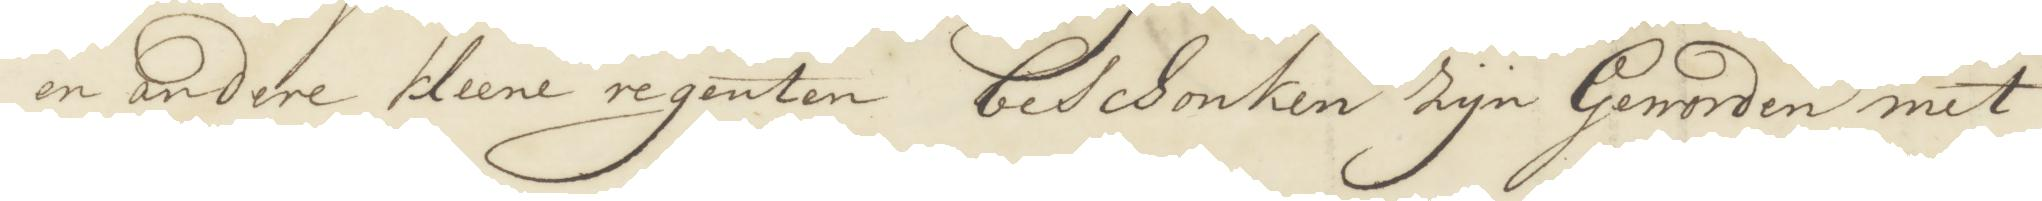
en andere kleene regenten beschonken zijn Geworden met
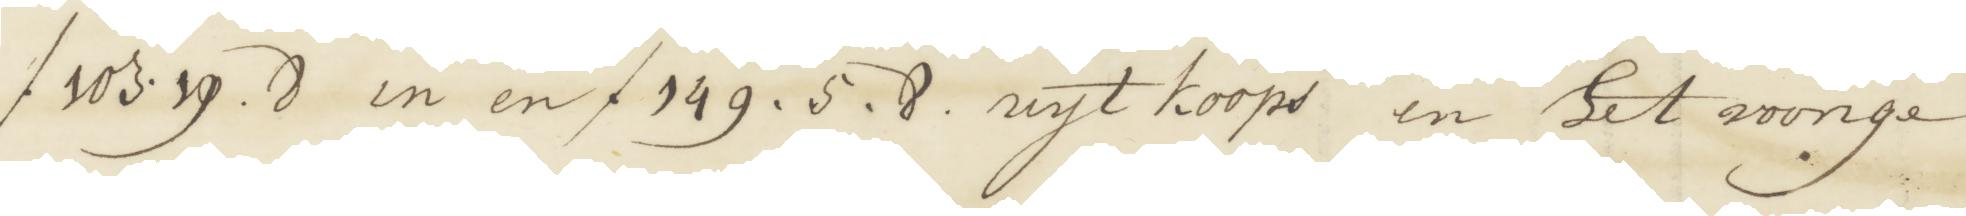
ƒ103. 19. 8 in en ƒ149. 5. 8. uijt koops en het voorige
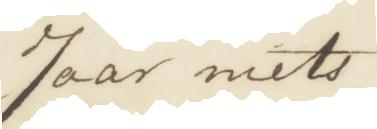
Jaar niets
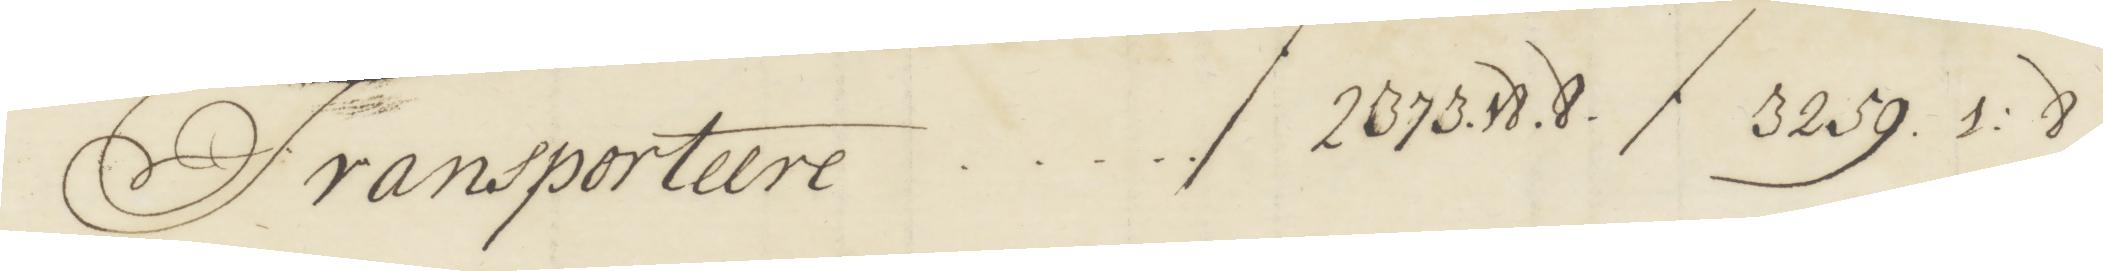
Transporteere . . . . .ƒ 2373.18. 8. ƒ 3259. 1: 8
